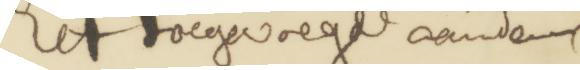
het toegevoegde aanden
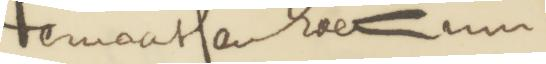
ternaatsen hoecum
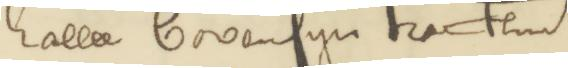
hallee boven sijn tractem
